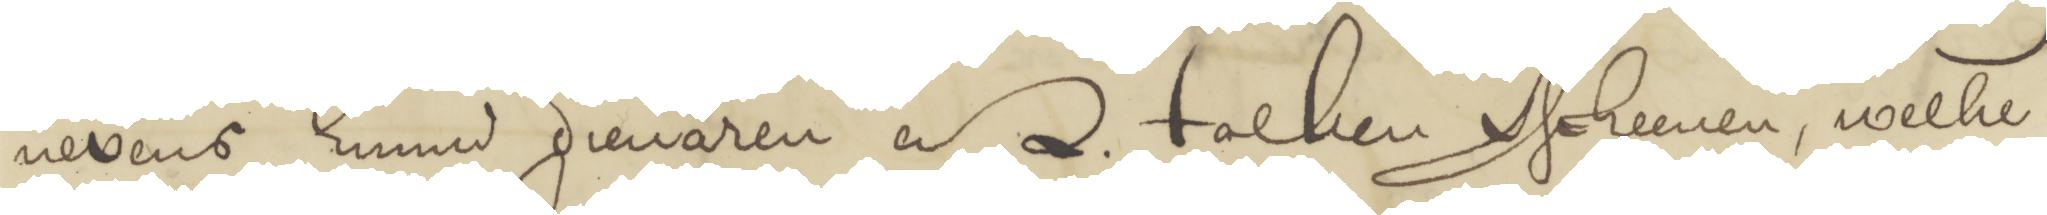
nevens hunne dienaren a 2. talken verscheenen, welke
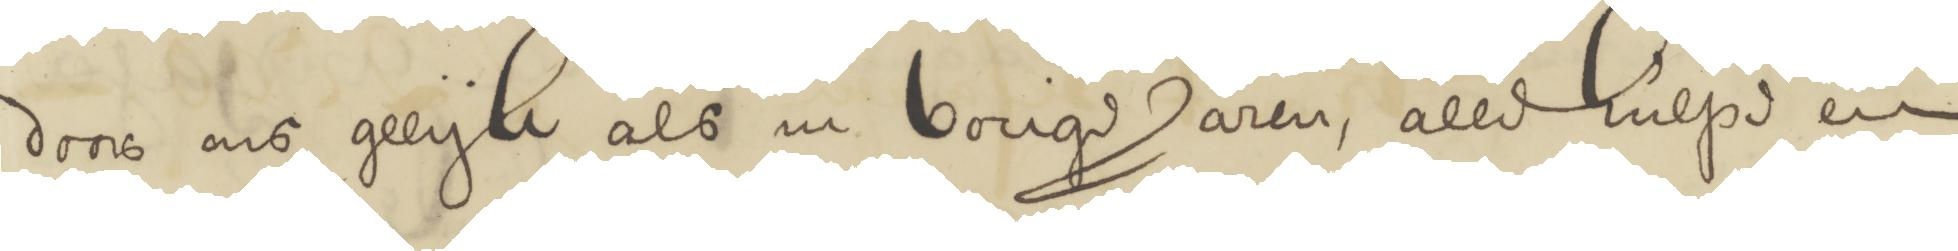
door ons gelijk als in vorige Jaren, alle hulpe en
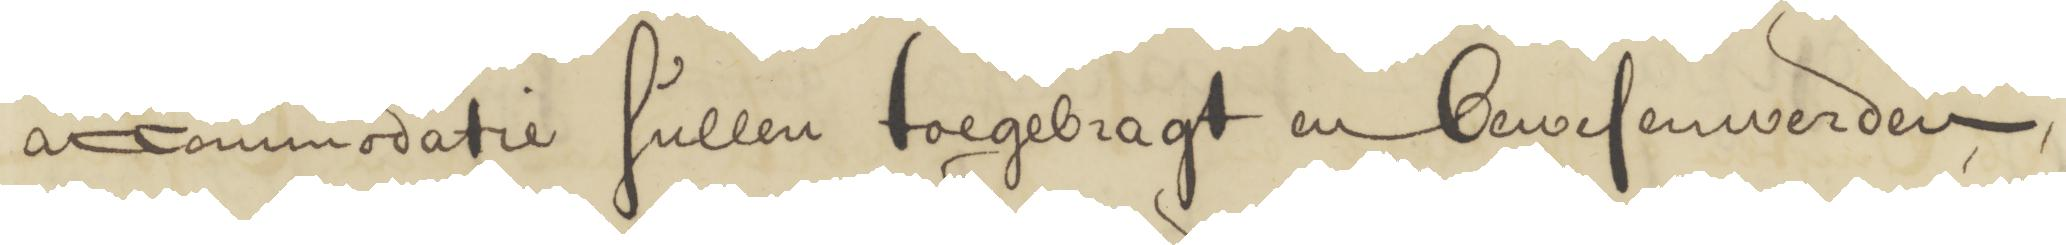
accommodatie sullen toegebragt en bewesen werden,
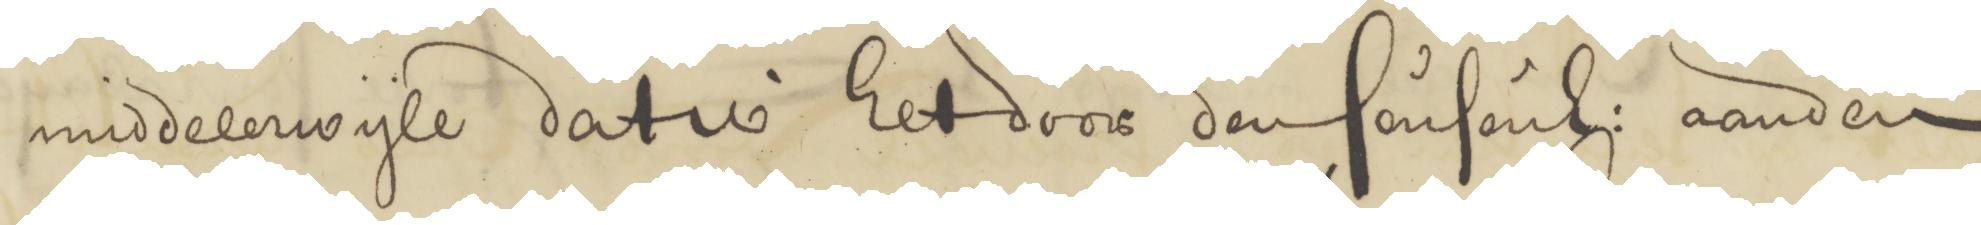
middelerwijle dat w' het door den sousouh: aanden
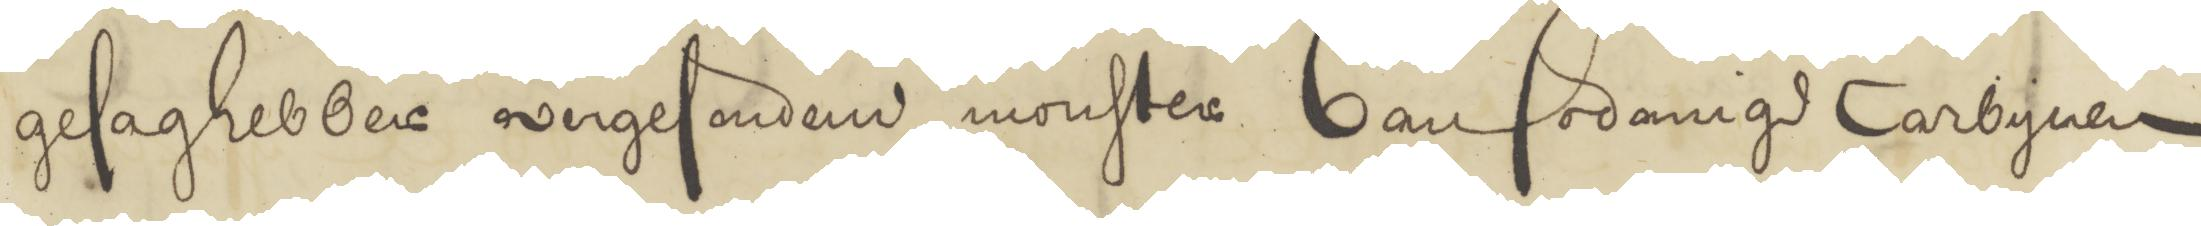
gesaghebber overgesondene monster van sodanige Carbijnen
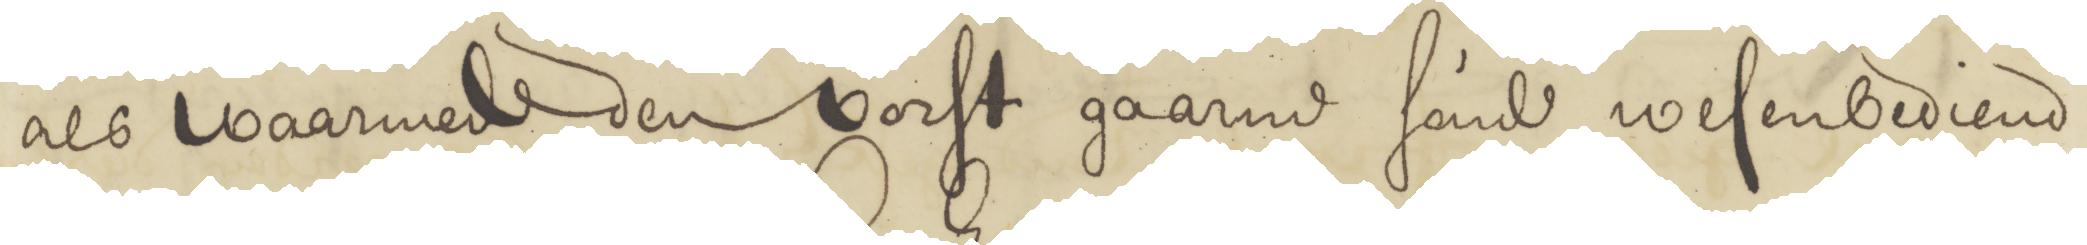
als waarmede den vorst gaarne soude wesen bediend
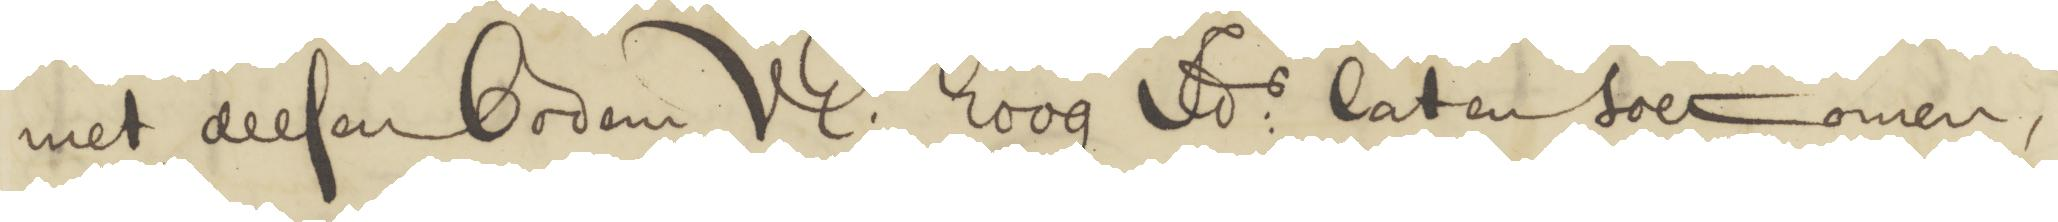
met deesen bodem VE: hoog Ed:s laten toecomen,
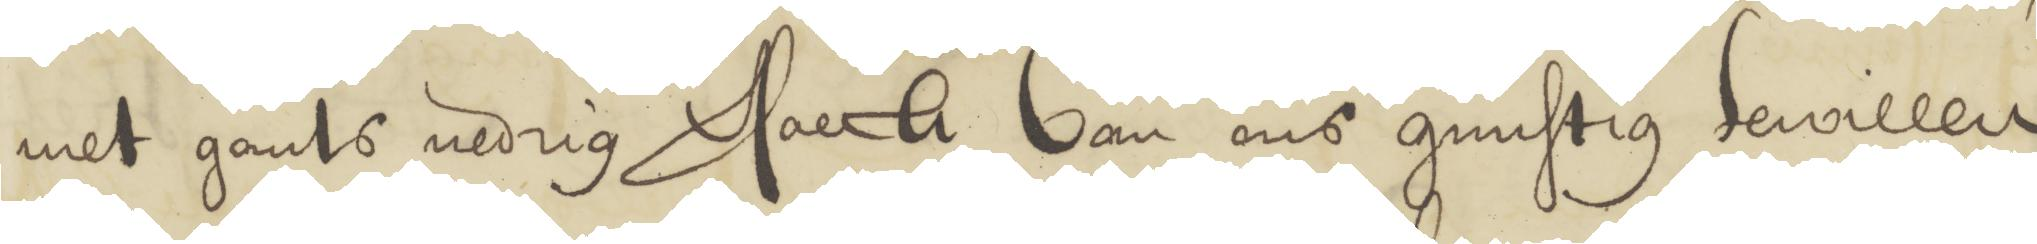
met gants nedrig versoeck van ons gunstig te willen
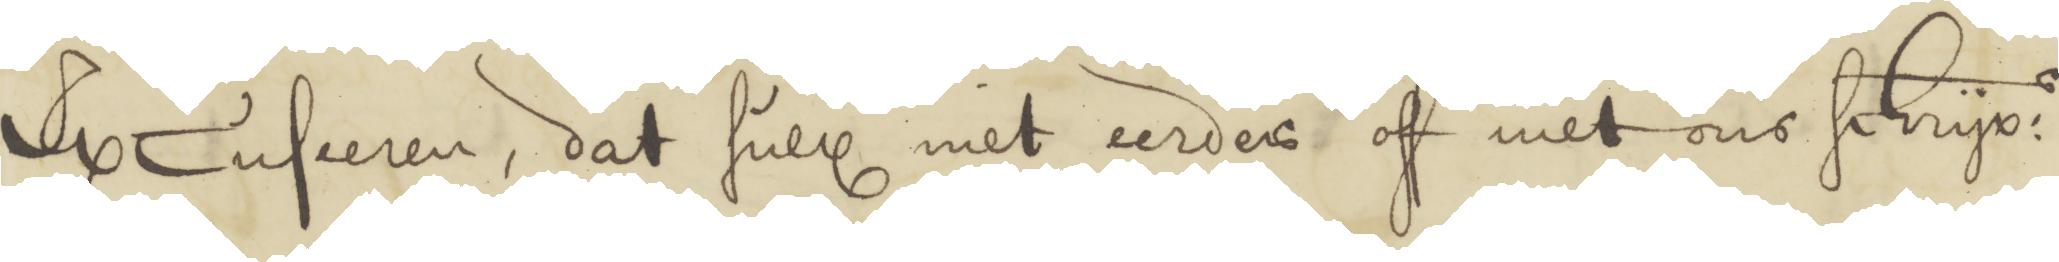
Excuseeren, dat sulx niet eerder off met ons schrijv:s
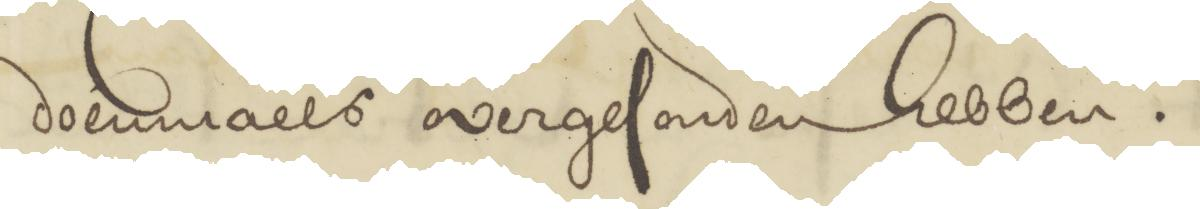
doenmaels overgesonden hebben.
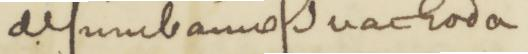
de sumbauwse nachoda
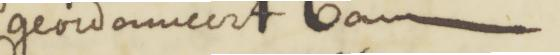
geordonneert van
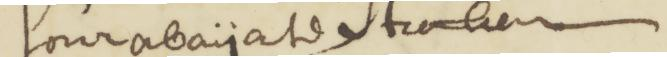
sourabaija te vertrocken
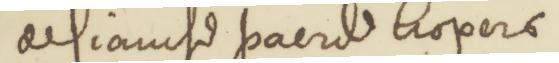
de siamse paerde kopers
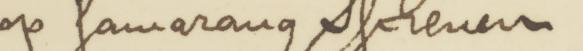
op samarang verschenen
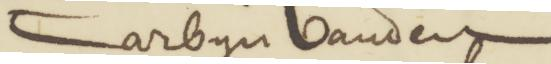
carbijn van den
